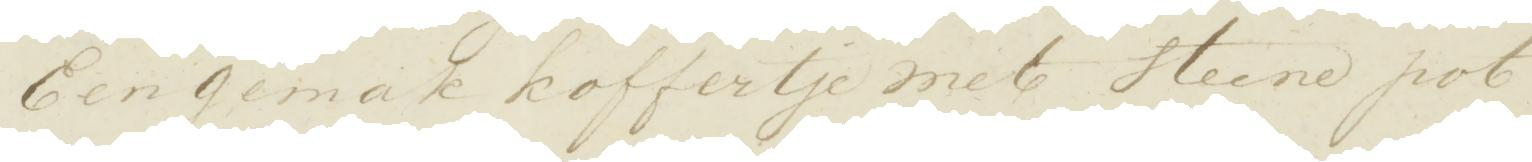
Een gemak koffertje met steene pot
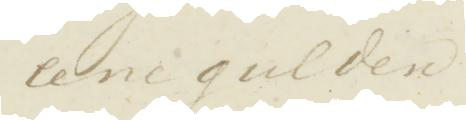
eene gulden
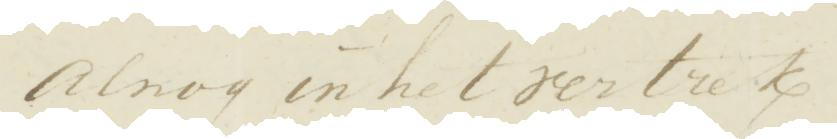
Alnog in het vertrek
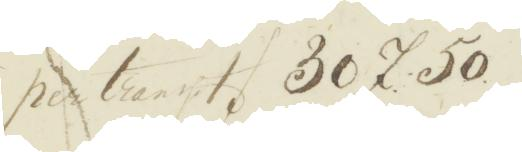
per transpt ƒ 307: 50.
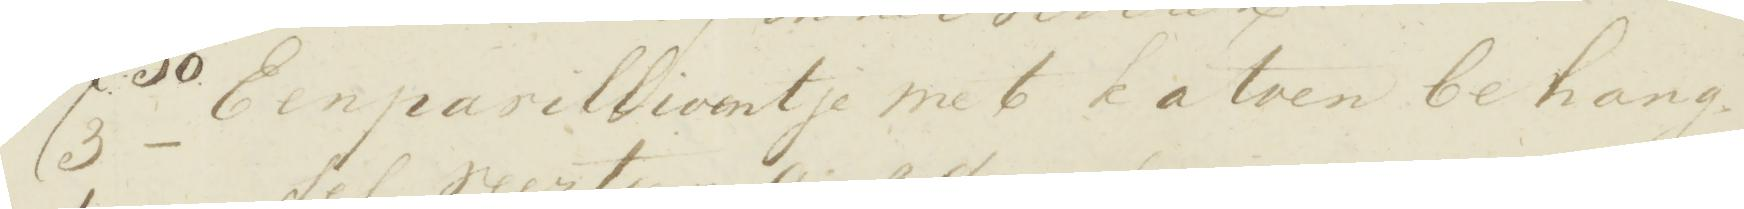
3 — Een pavillioentje met katoen behang.
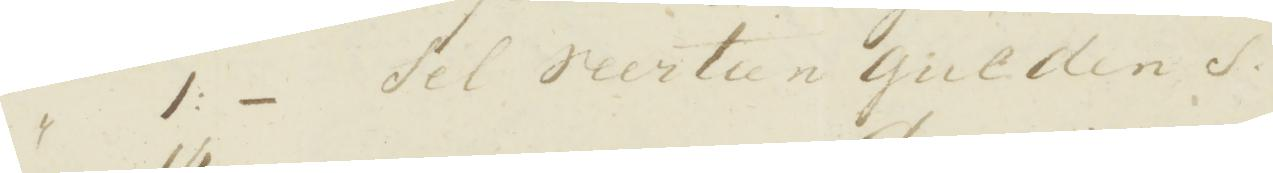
„ 1: — sel veertien Guldens.
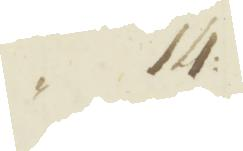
„ 14:
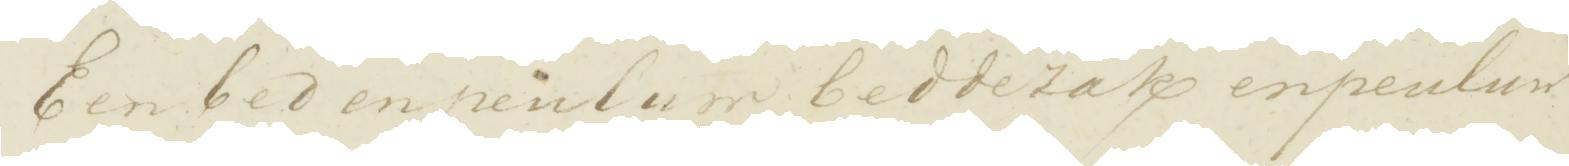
Een bed en peuluw beddezak en peuluw
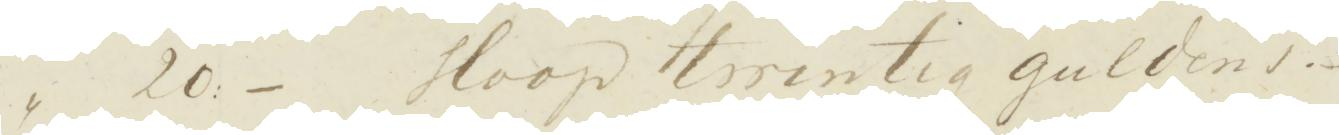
„ 20: — sloop twintig guldens. —
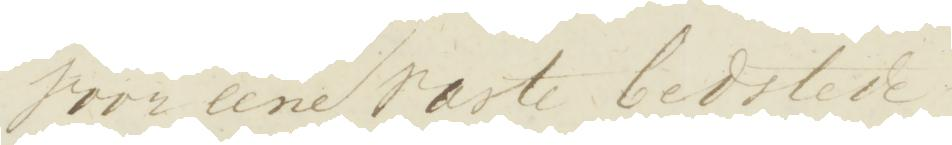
Voor eene Vaste bedstede
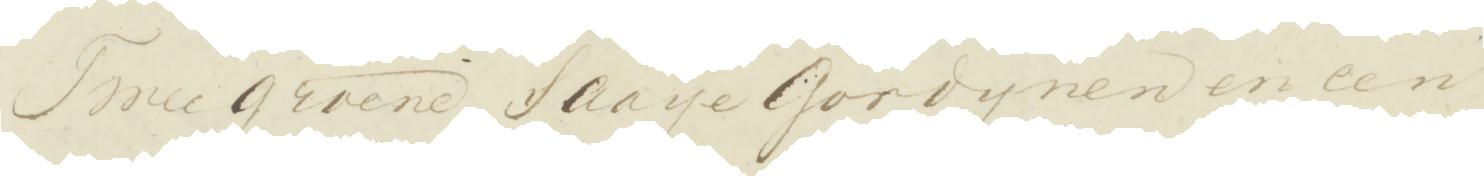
Twee groene Saaije Gordijnen en een
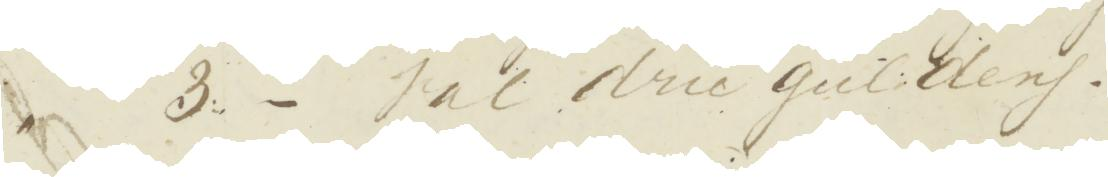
„ 3: — Val drie Guldens.
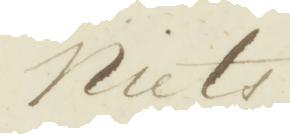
Niets
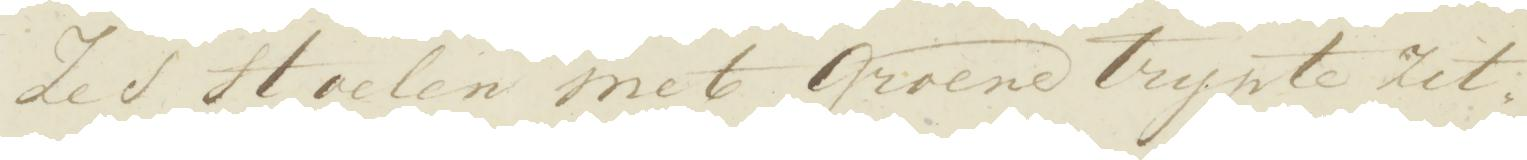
Zes stoelen met Groene trijpte zit„
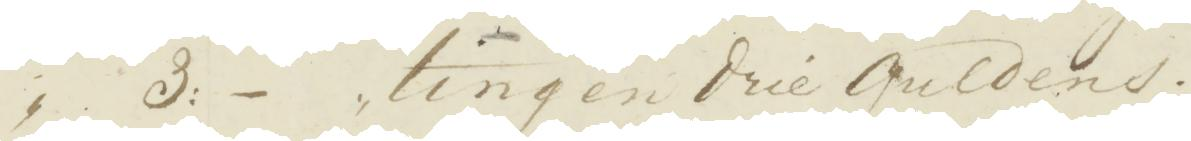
„ 3: — „tingen drie Guldens.
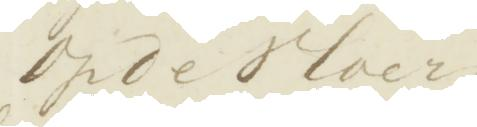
Op de Vloer —
